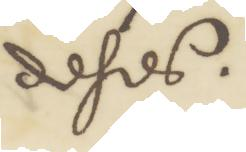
deses.
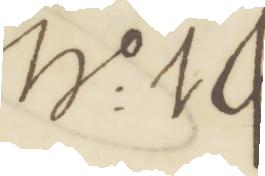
N:o 14
